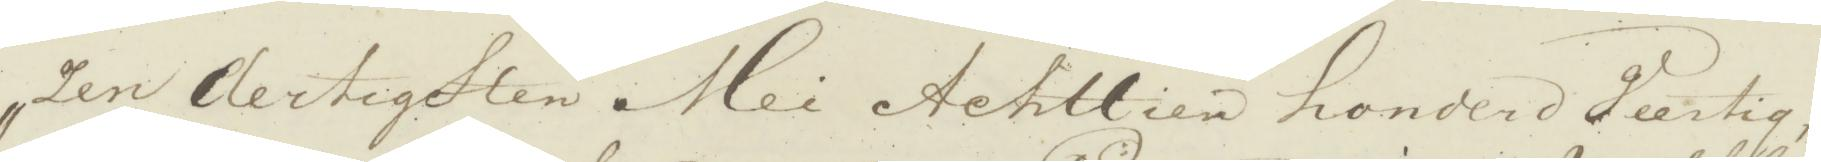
„zen dertigsten Mei Achttien honderd Veertig,
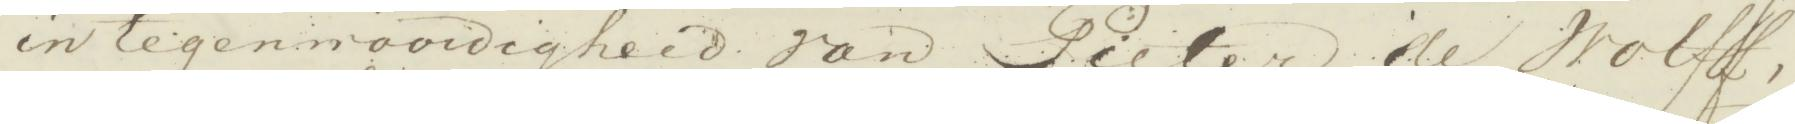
in tegenwoordigheid van Pieter de Wolff,
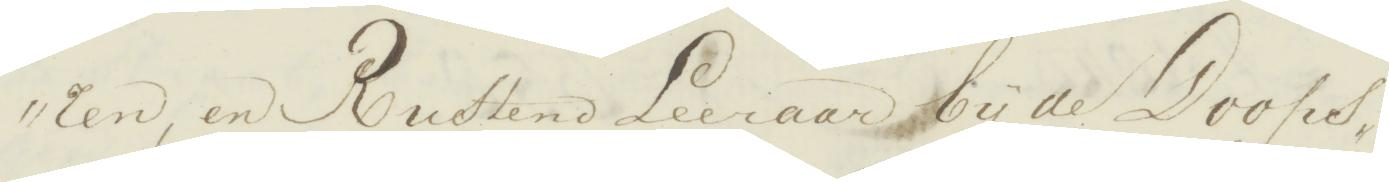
„ren, en Rustend Leeraar bij de Doops„
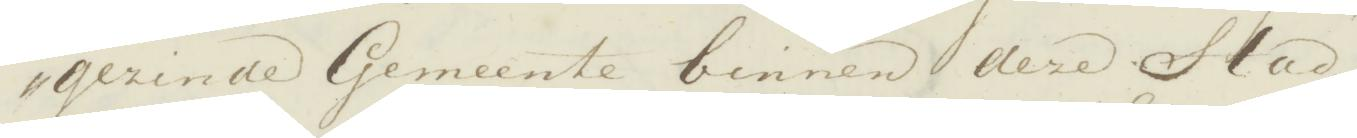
„gezinde Gemeente binnen deze Stad,
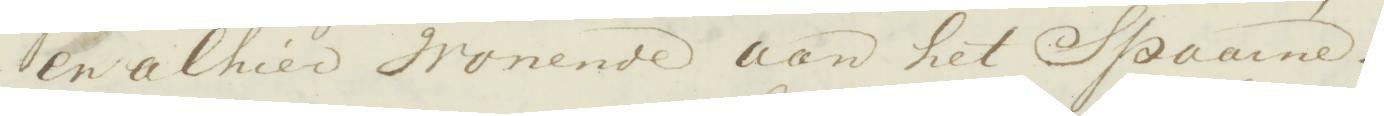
en alhier wonende aan het Spaarne.
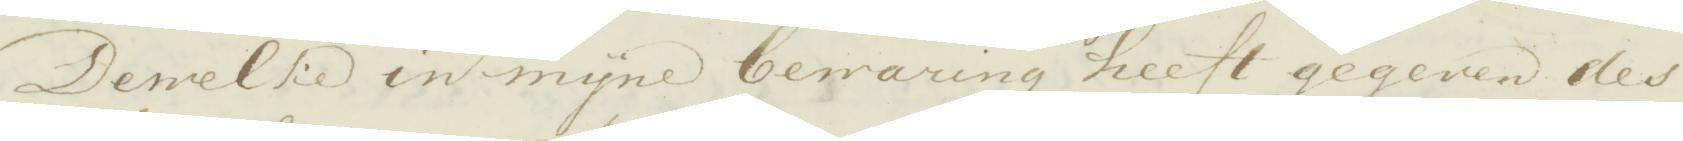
Dewelke in mijne bewaring heeft gegeven des
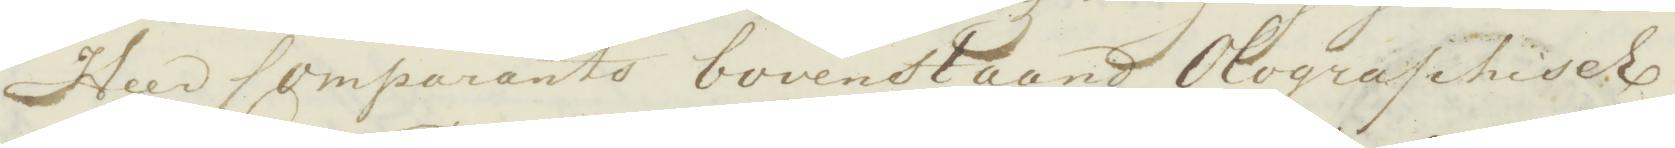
Heer Comparants bovenstaand Olographisch
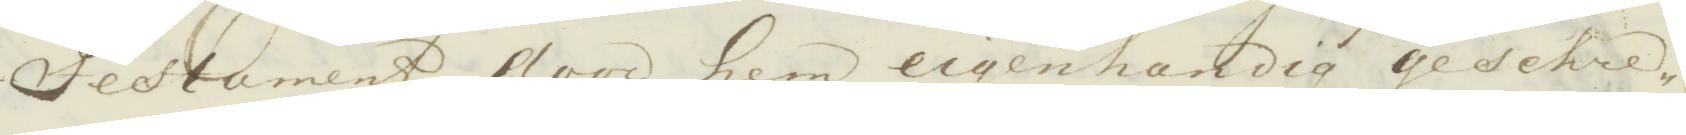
Testament, door hem eigenhandig geschre„
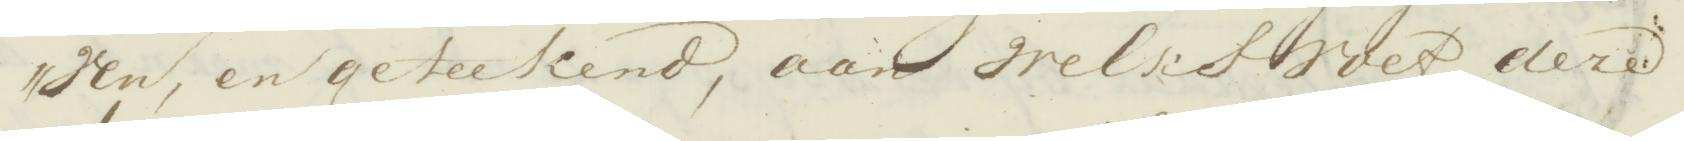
„ven, en geteekend, aan welks voet deze
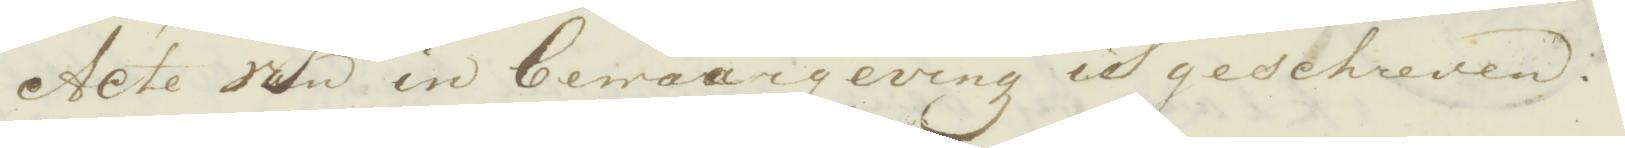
Acte van in bewaargeving is geschreven:
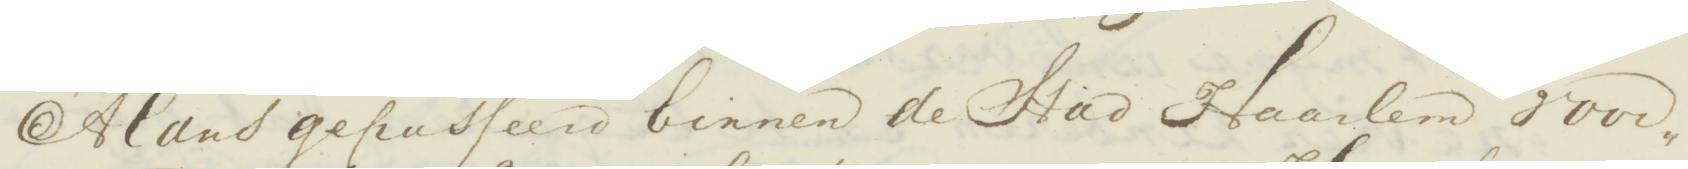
Aldus gepasseerd binnen de Stad Haarlem voor„
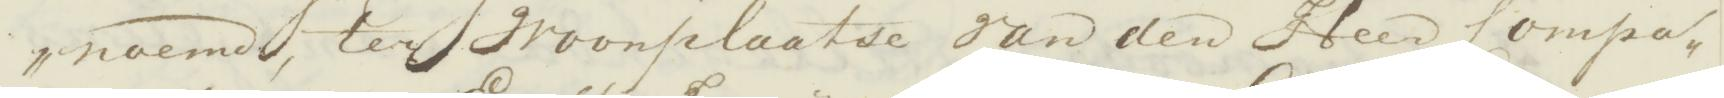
„noemd, ter Woonplaatse van den Heer Compa„
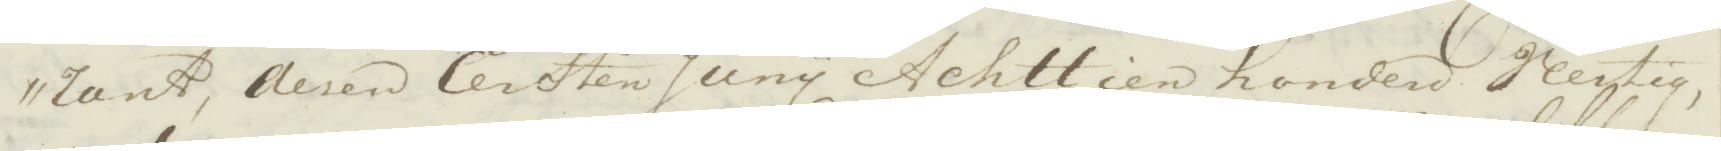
„rant, dezen Eersten Junij Achttien honderd Veertig,
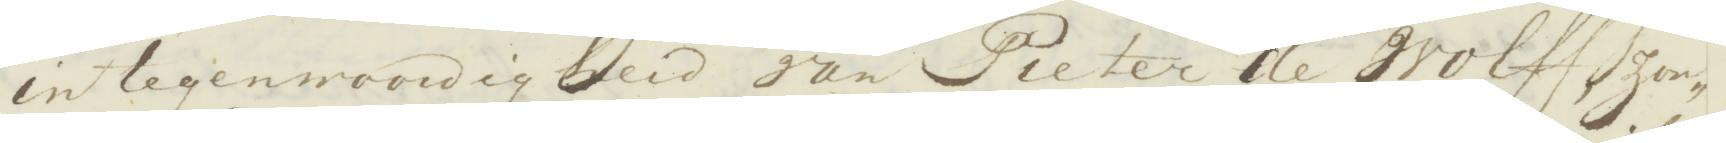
in tegenwoordigheid van Pieter de Wolff zon„
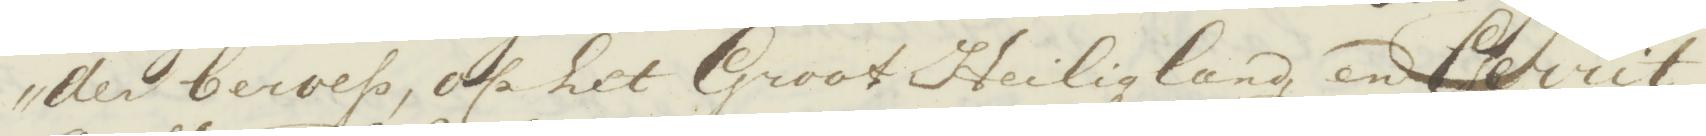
„der beroep, op het Groot Heiligland, en Gerrit
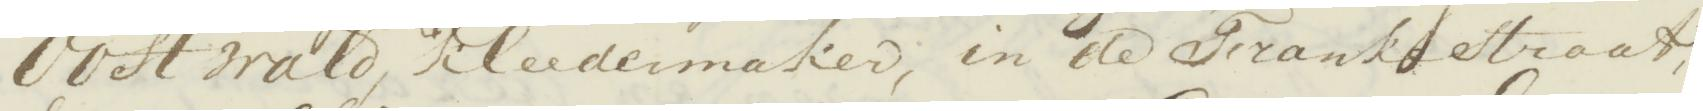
Oost wald, Kleedermaker, in de Frankestraat,
